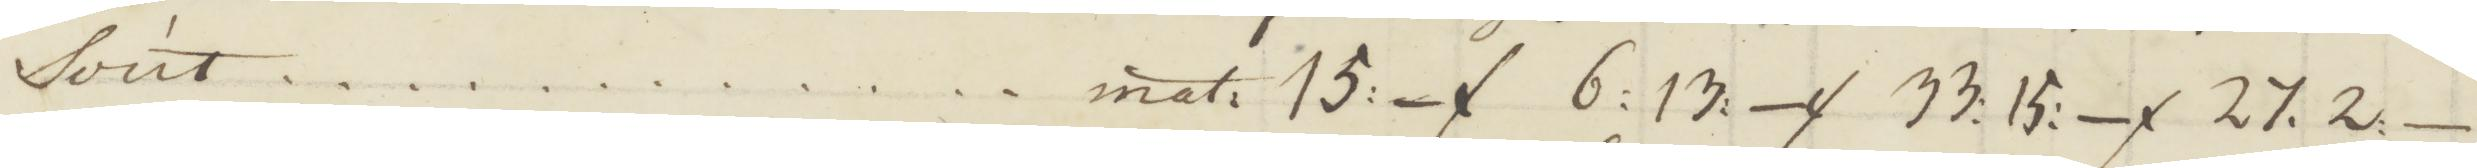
sout . . . . . . . . . . . . mat: 15:—ƒ 6:13:—ƒ 33:15:—ƒ 27.2:—
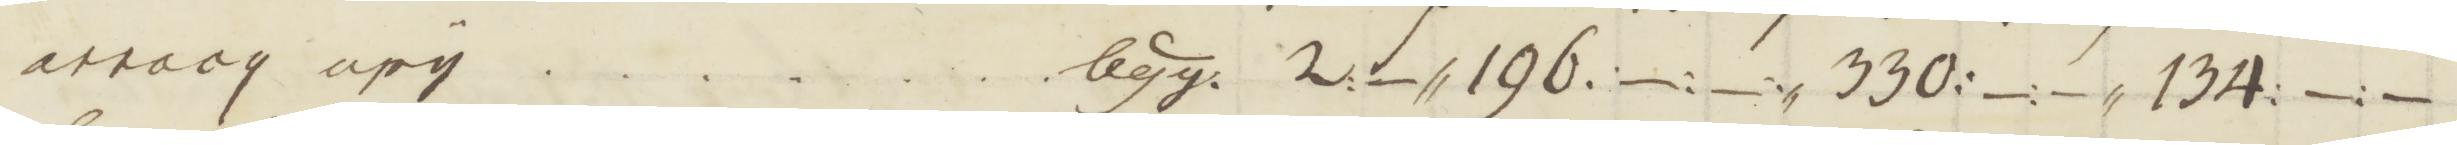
arraaq apij . . . . . . . bgij 2:—„196:—.—:„ 330:—:—„ 134:—.—
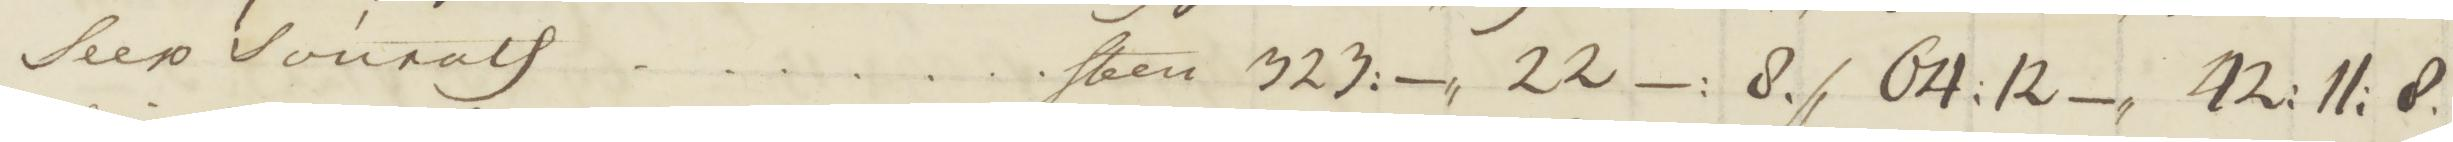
seep sourats steen 323:—„ 22—: 8:„ 64:12—„ 42:11:8.
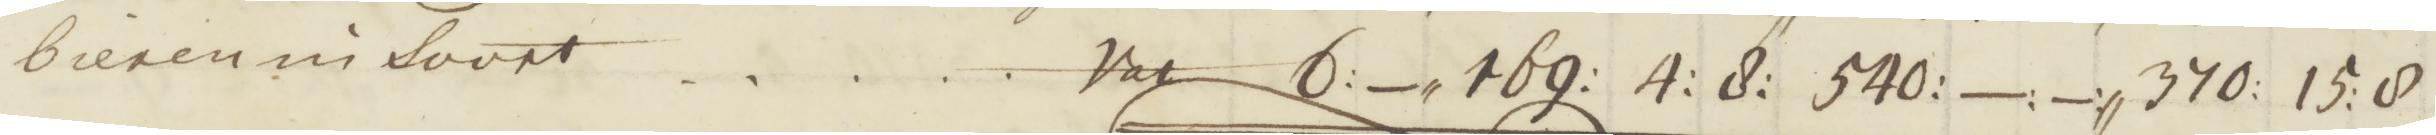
bieren in soort . . . . . Vat 6:—„ 169:4:8: 540:—:—:„ 370:15:8
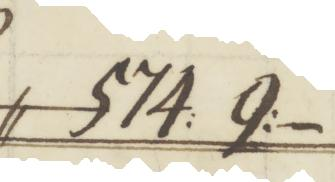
„ 574:9:—
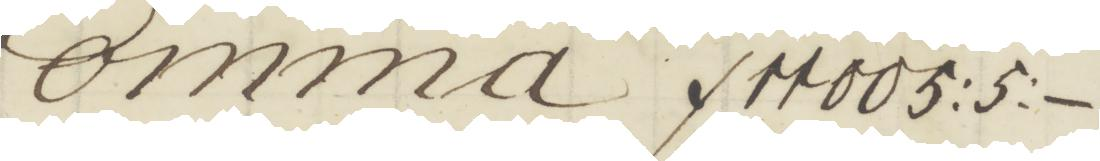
omma ƒ11005:5:—
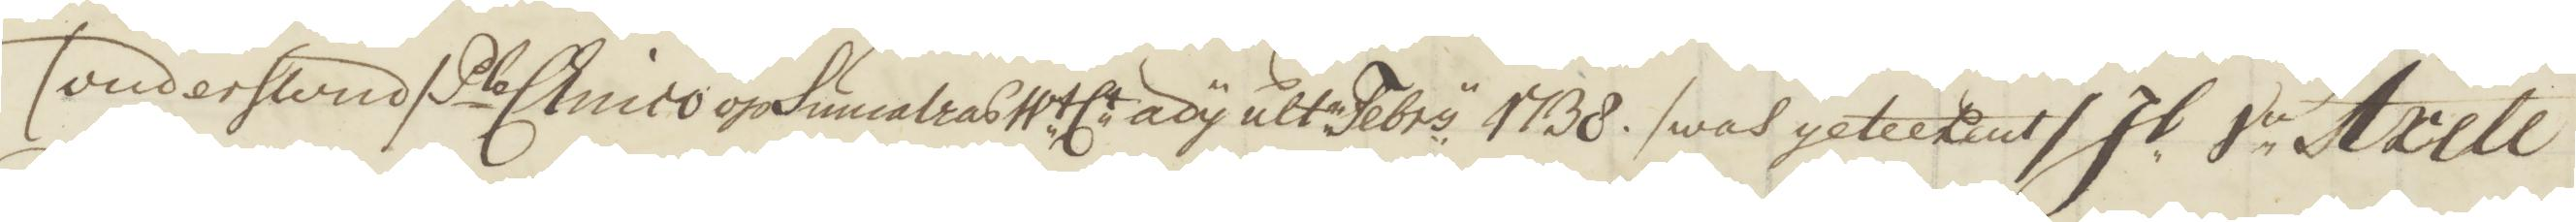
/onderstond/ P=le Chinco op Sumatras W„t C„t adij ult„o Febr„ij 1738. /was geteekent/ J„b V„an Axele
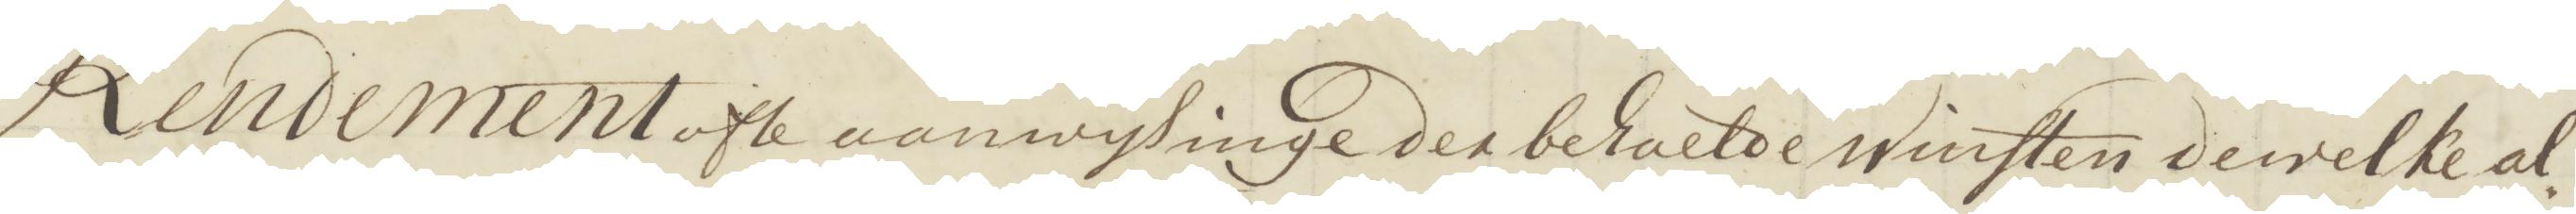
Rendement ofte aanwijsinge der behaelde winsten dewelke al„
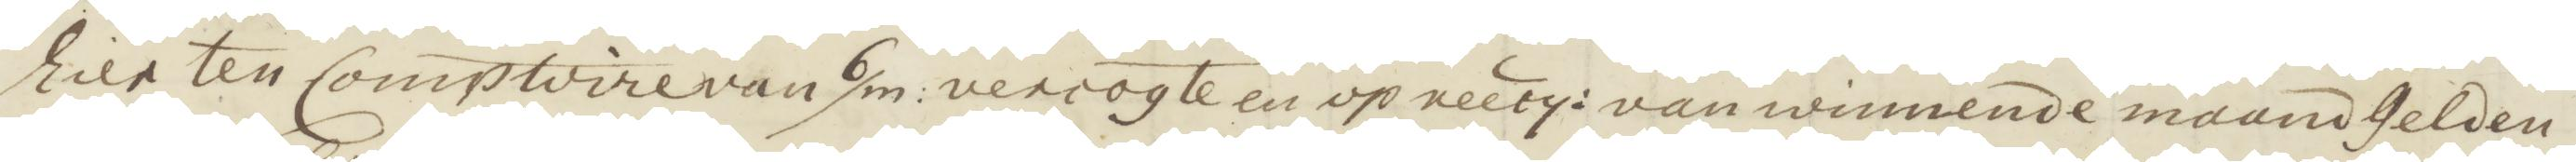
hier ten Comptoire van 6/m: vercogte en op reecq: van winnende maandgelden
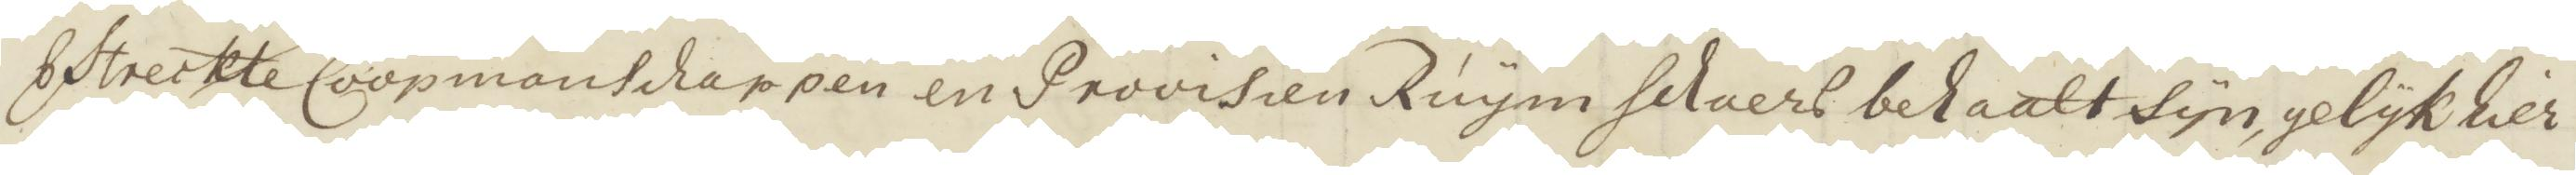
verstreckte Coopmanschappen en Provisien Ruijm schaers behaalt sijn, gelijk hier
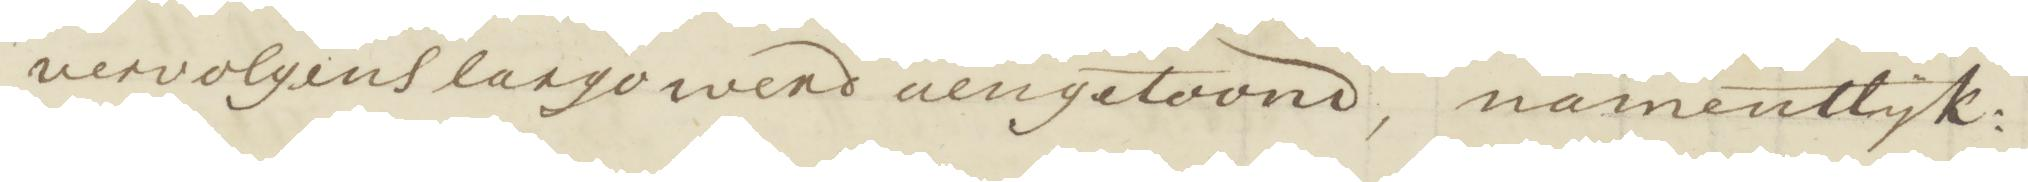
vervolgens largo werd aengetoond, namentlijk:
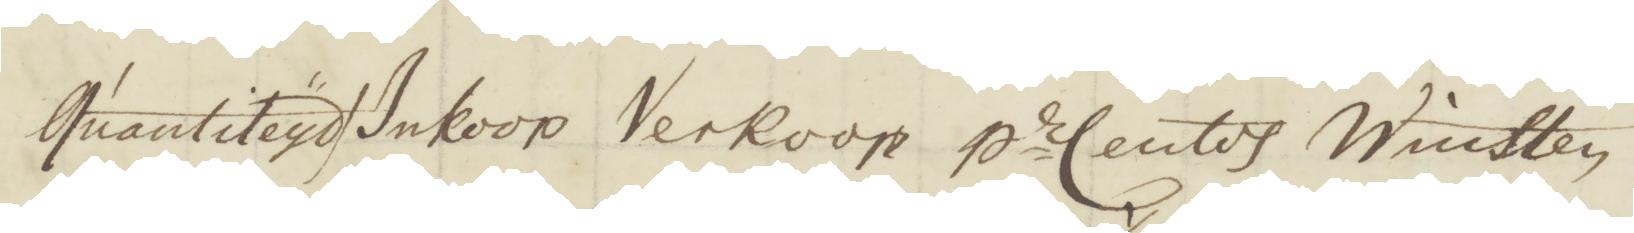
Quantiteijd/ Inkoop Verkoop p=rCentos Winsten
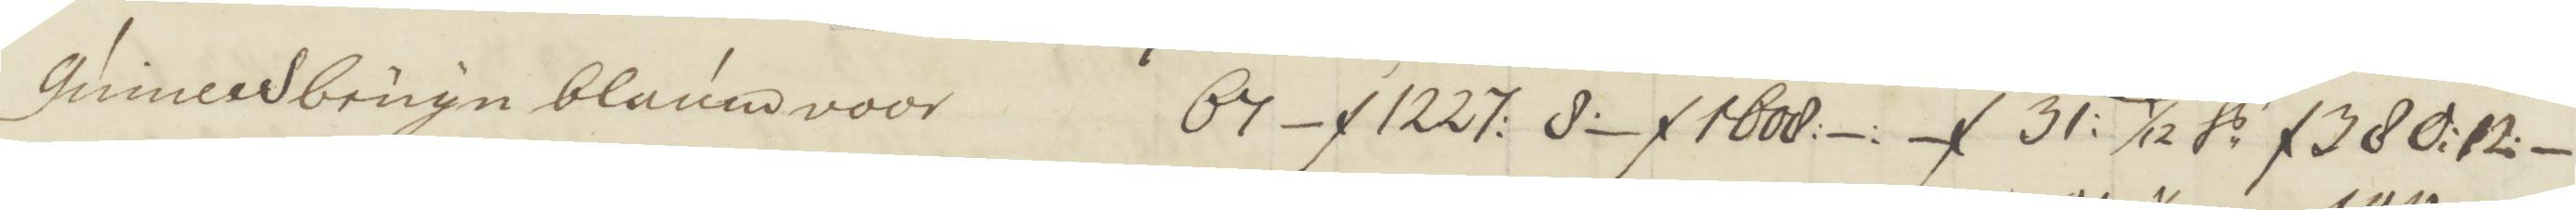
guinees bruijn blauw voor 67—ƒ1227:8:—ƒ1608:—:—ƒ 31:1/12 s„t ƒ380:12:—
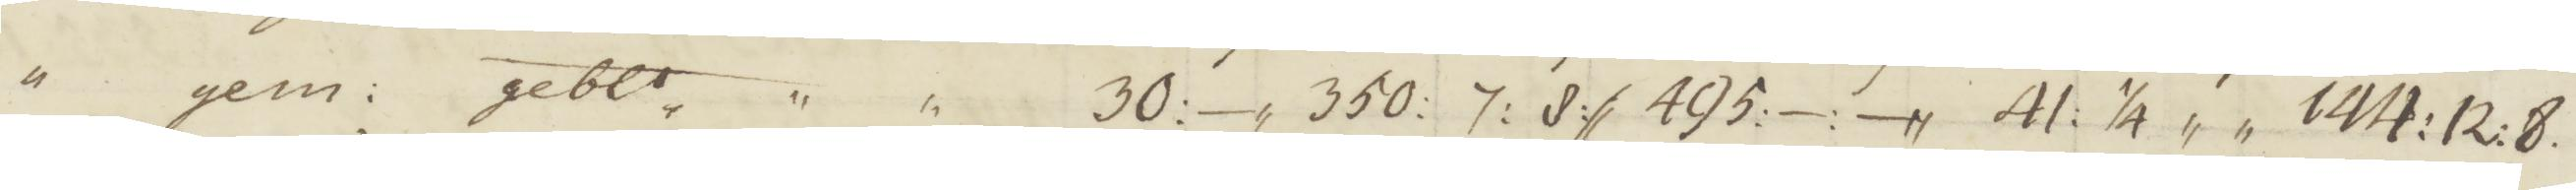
„ gem: gebl„t „ „ 30:—„ 350: 7: 8:„ 495:—:—„ 41: ¼ „ „ 144:12:8.
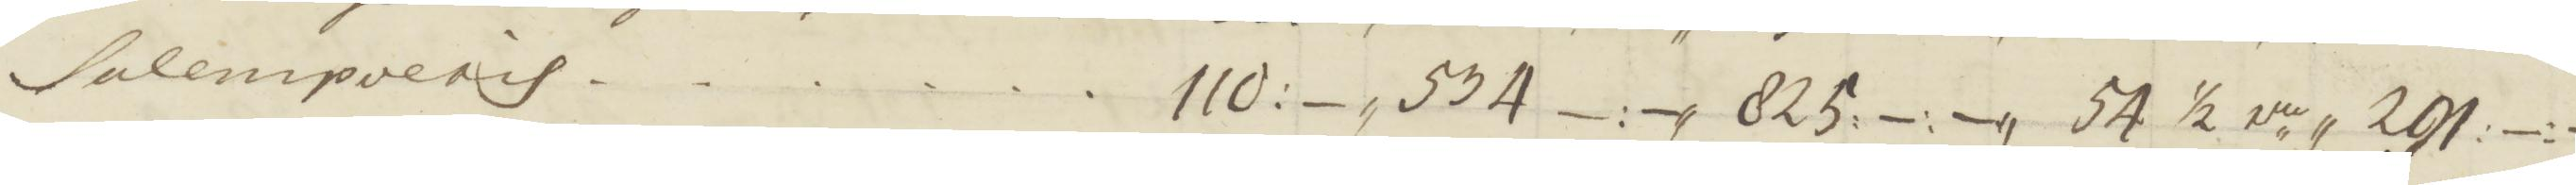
Salempoeris . . . . . . 110:—„534 —:—„ 825:—:—„ 54 ½ r„m „ 291:—:
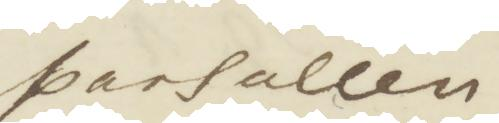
parsallen
